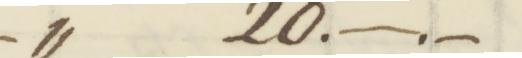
-„ 20.—.—
